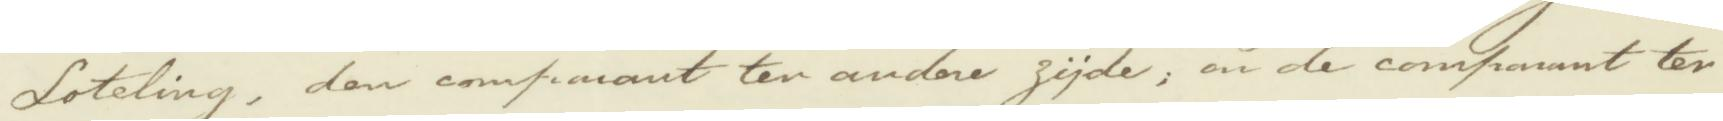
Loteling, den comparant ter andere zijde; en de comparant ter
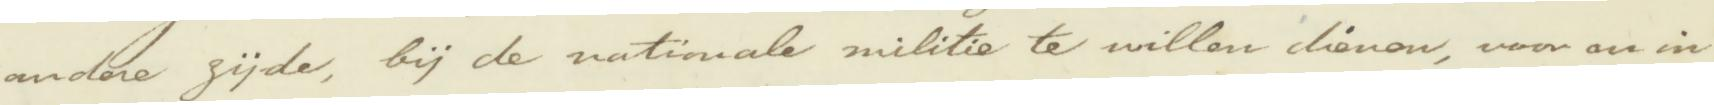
andere zijde, bij de nationale militie te willen dienen, voor en in
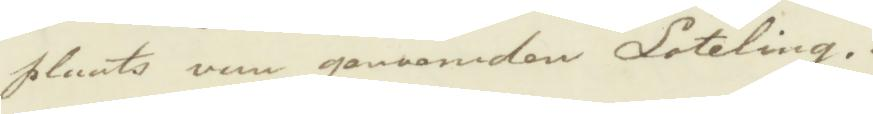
plaats van genoemden Loteling.
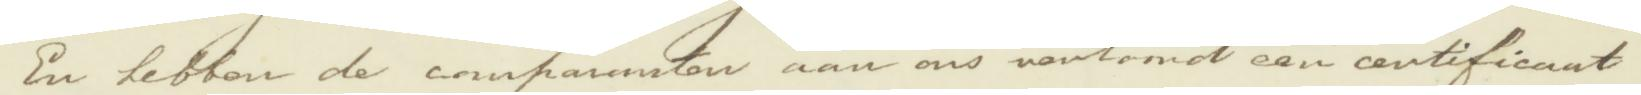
En hebben de comparanten aan ons vertoond een certificaat
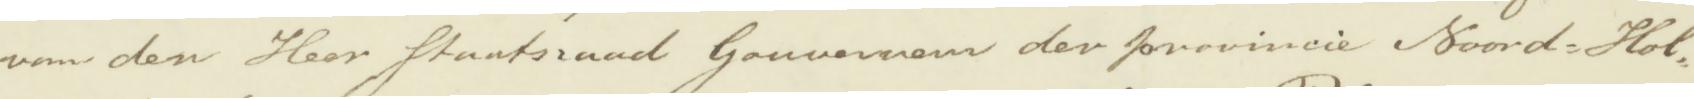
van den Heer staatsraad Gouverneur der provincie Noord= Hol„
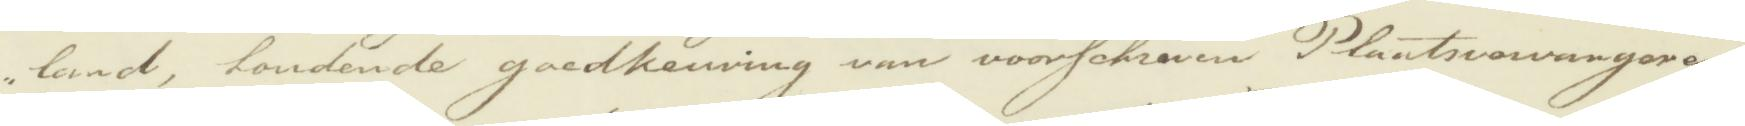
land, houdende goedkeuring van voorschreven Plaatsvervanger en
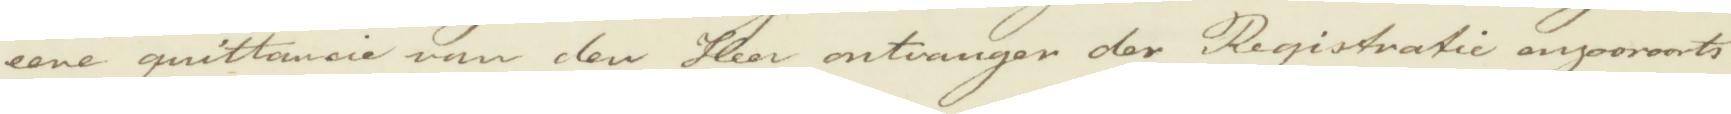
eene quittancie van den Heer ontvanger der Registratie enzovoorts
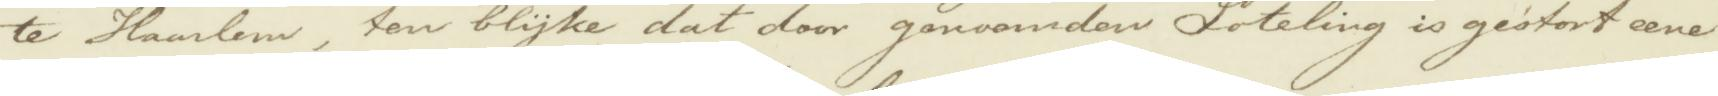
te Haarlem, ten blijke dat door genoemden Loteling is gestort eene
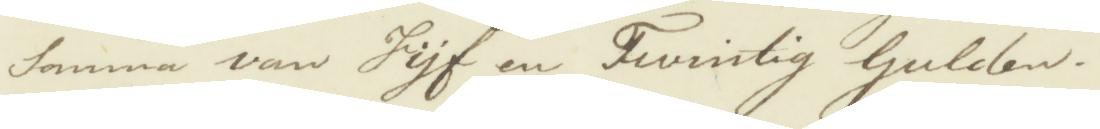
somma van Vijf en Twintig Gulden.
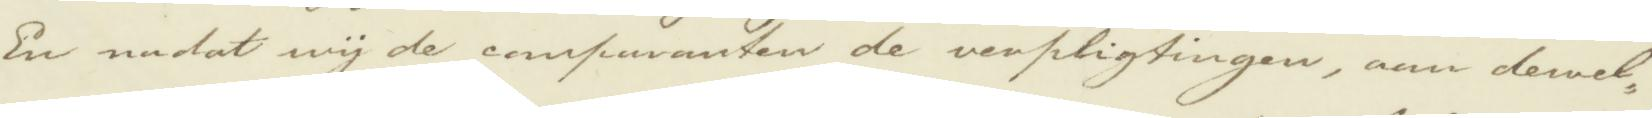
En nadat wij de comparanten de verpligtingen, aan dewel„
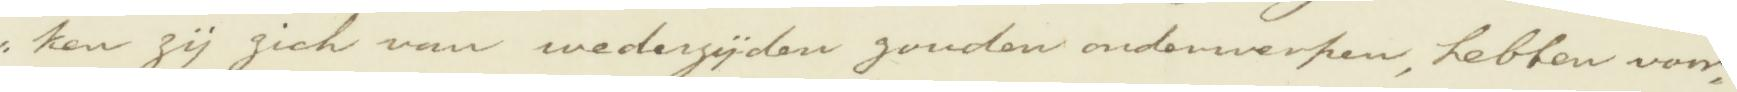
„ken zij zich van wederzijden zouden onderwerpen, hebben voor„
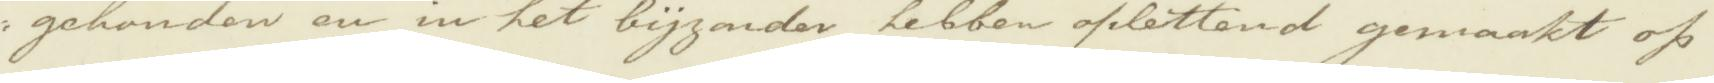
gehouden en in het bijzonder hebben oplettend gemaakt op
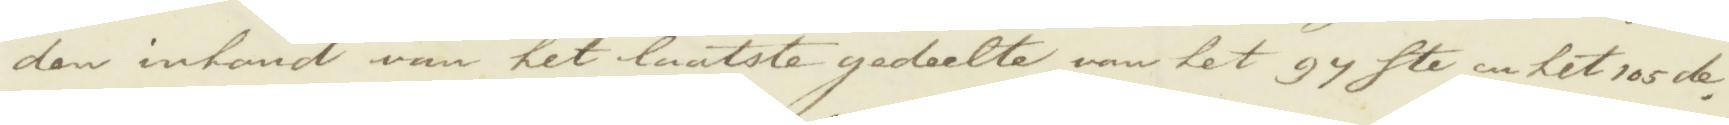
den inhoud van het laatste gedeelte van het 97ste en het 105 de-
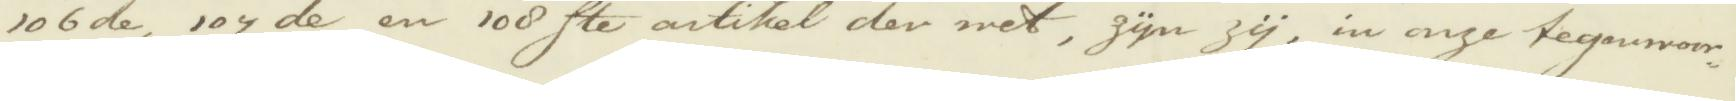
106de, 107de en 108ste artikel der wet, zijn zij, in onze tegenwoor„
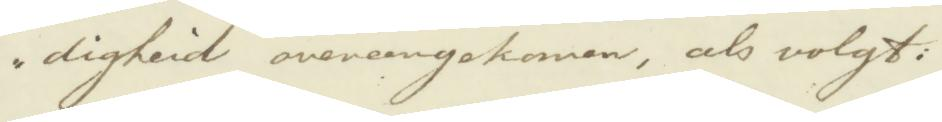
„digheid overeengekomen, als volgt:
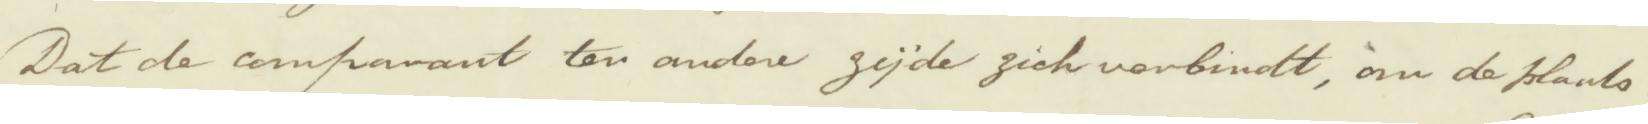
Dat de comparant ter andere zijde zich verbindt, om de plaats
